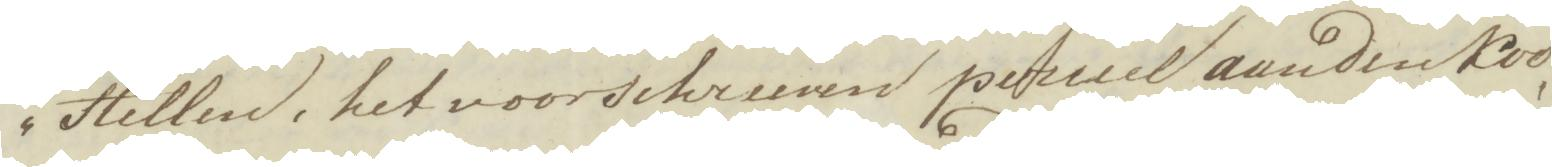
„stellen, het voorschreeven perceel aan den Koo„
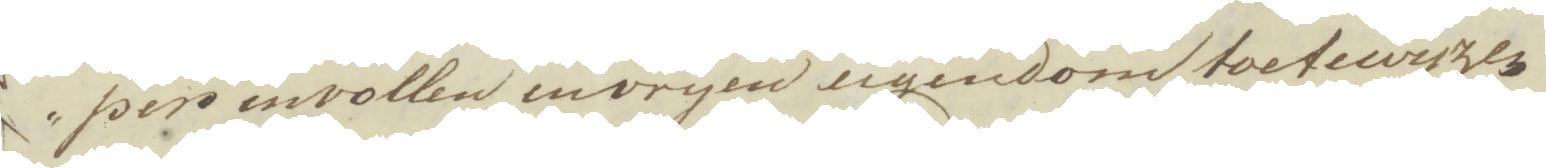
„per invollen en vryen eigendom toetewijzen
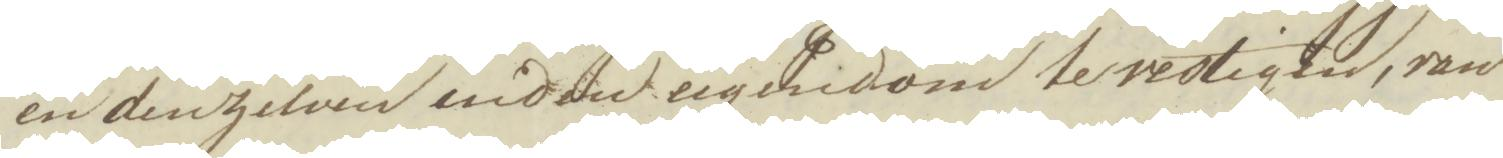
en denzelven in den eigendom te vestigen, van
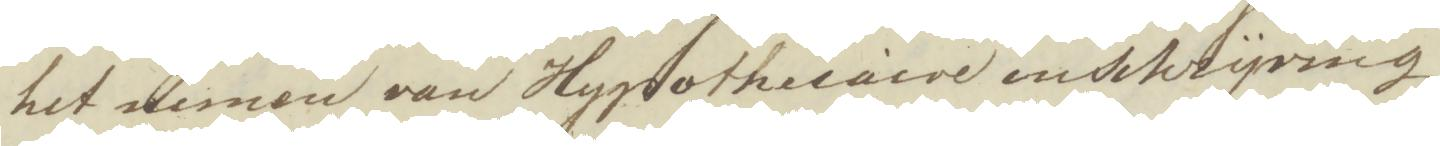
het innen van Hypothecaire inschrijving
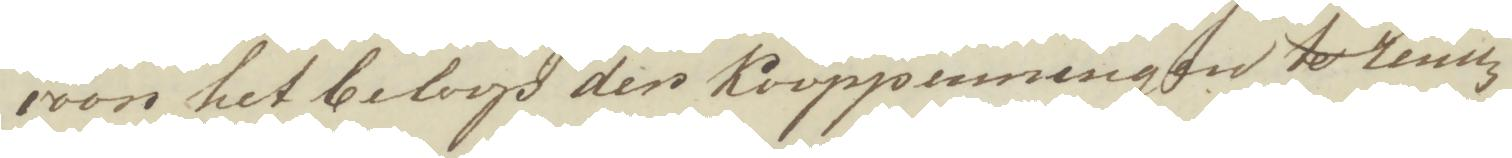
voor het beloop den Kooppenningen te renun
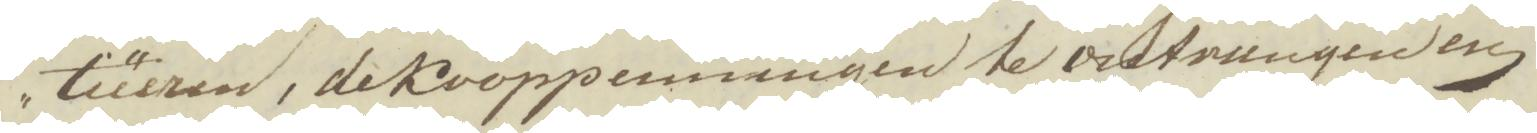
„tiëeren, de kooppenningen te ontvangen en
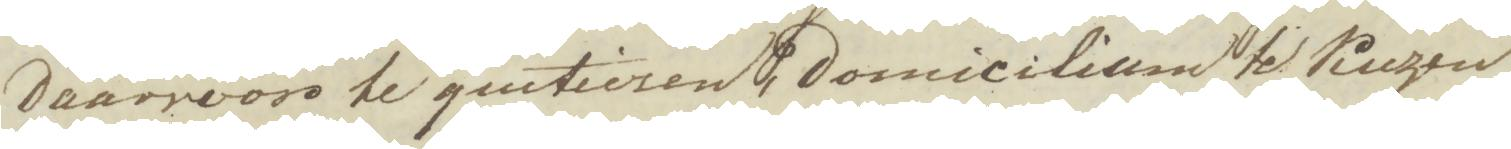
daarvoor te quiteeren, domicilium te Kiezen,
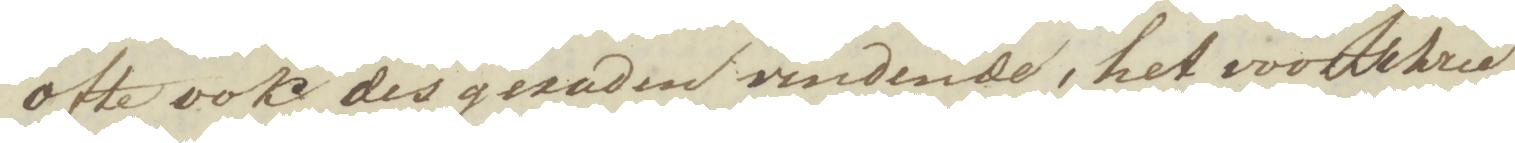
ofte ook des geraden vindende, het voorschree
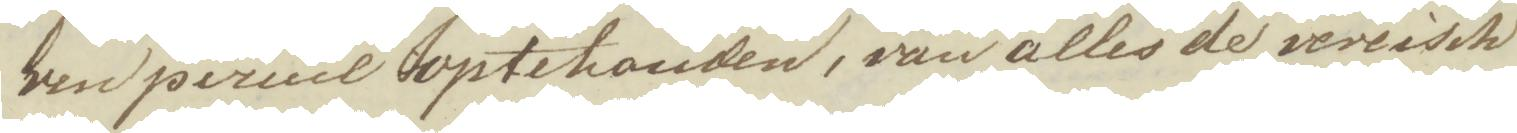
ven perceel optehouden, van alles de vereisch
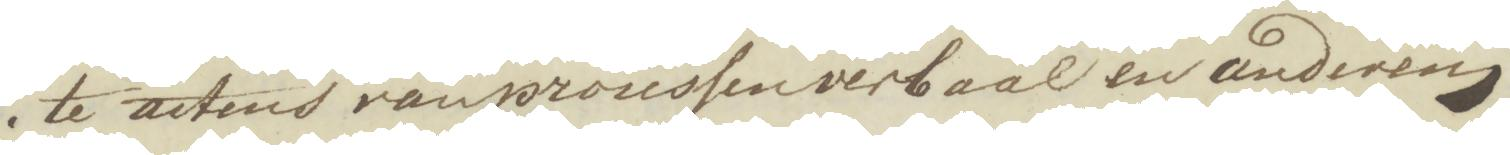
,te actens van processenverbaal en anderen
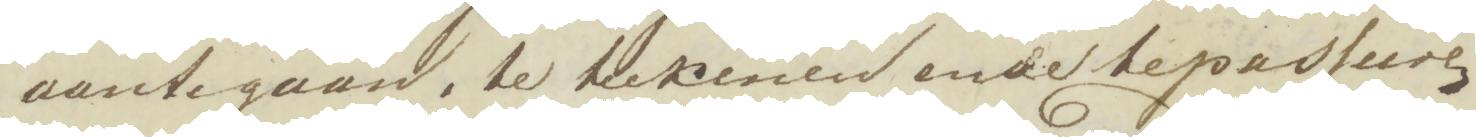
aan te gaan, te teekenen ende te passeeren,
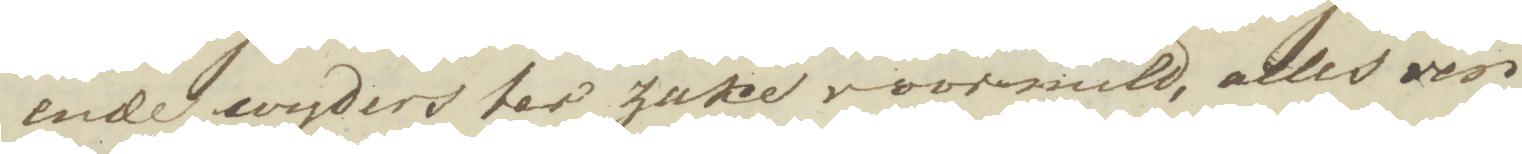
ende wyders ter zake voormeld, alles ver
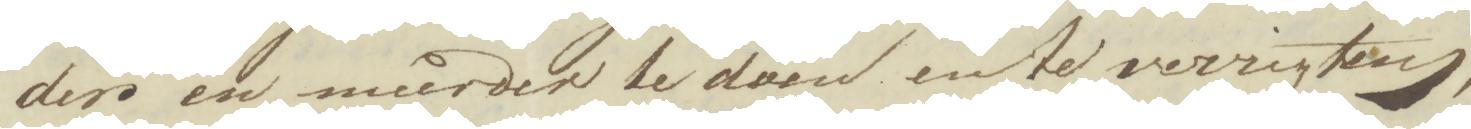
der en meerder te doen en te verrigten,
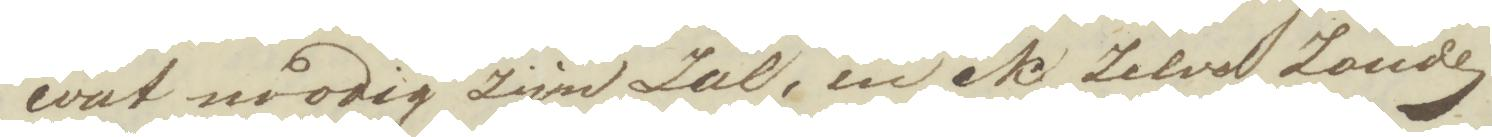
wat noodig zijn zal, en ik zelve zouden
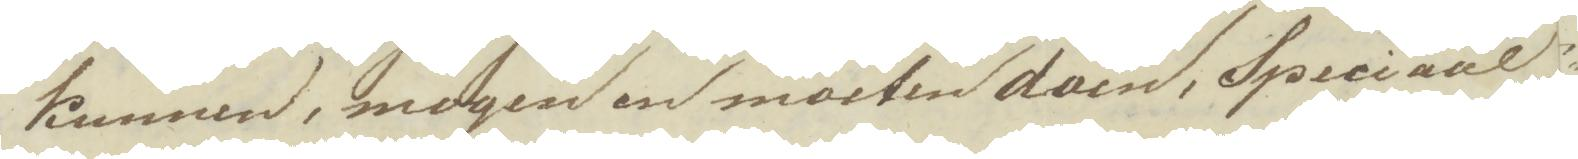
kunnen, mogen en moeten doen, Speciaal
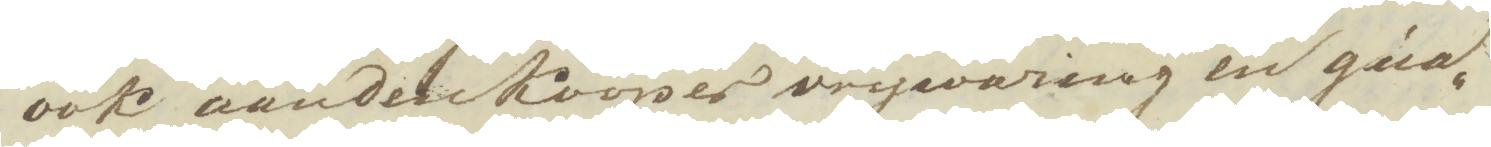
ook aan den Kooper vrywaring en gua„
